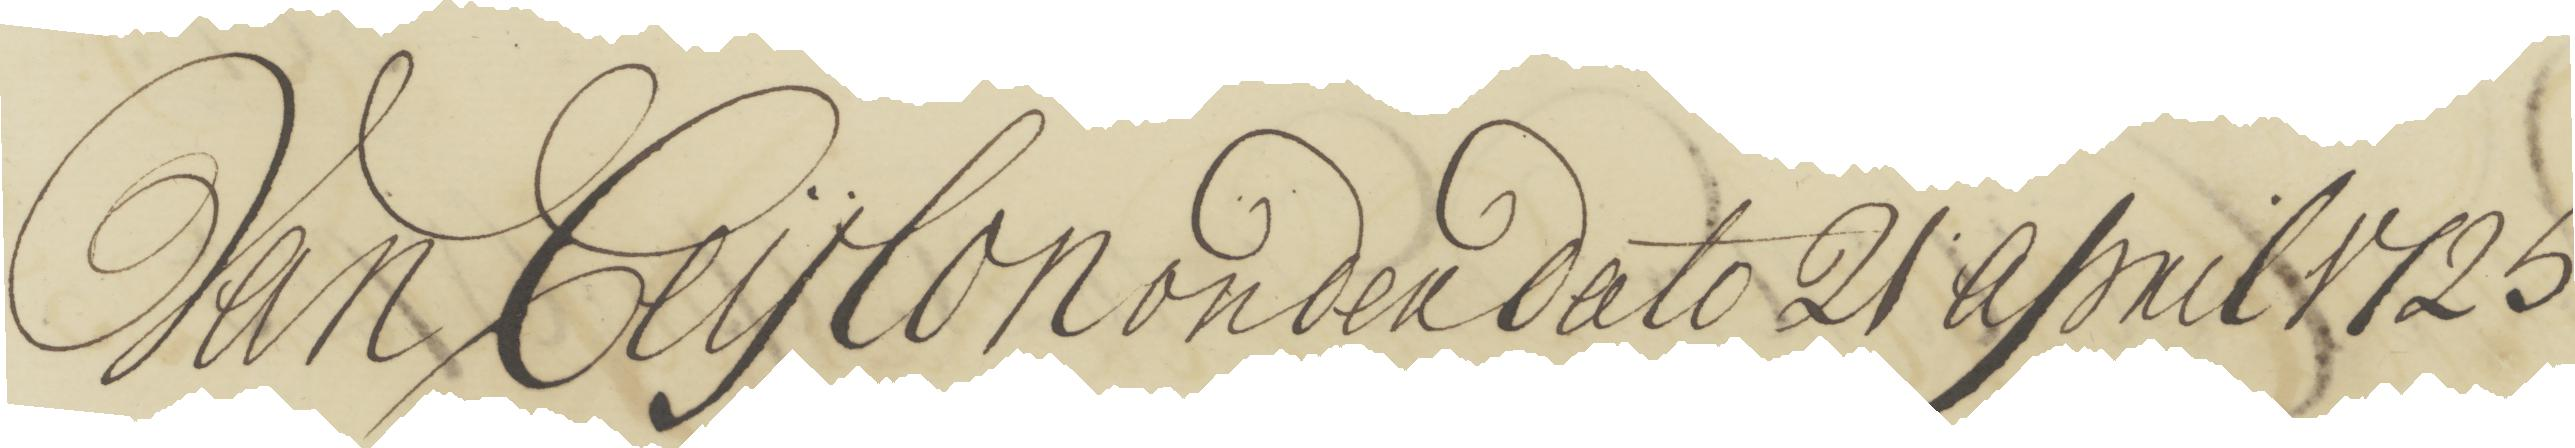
Van Ceijlon onder dato 21' april 1725
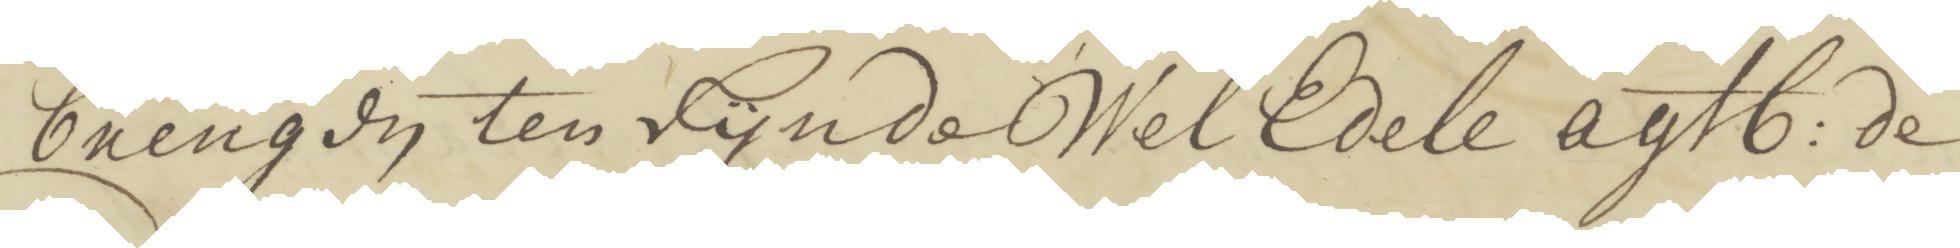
brengen ten Eijnde Wel Edele agtb: de
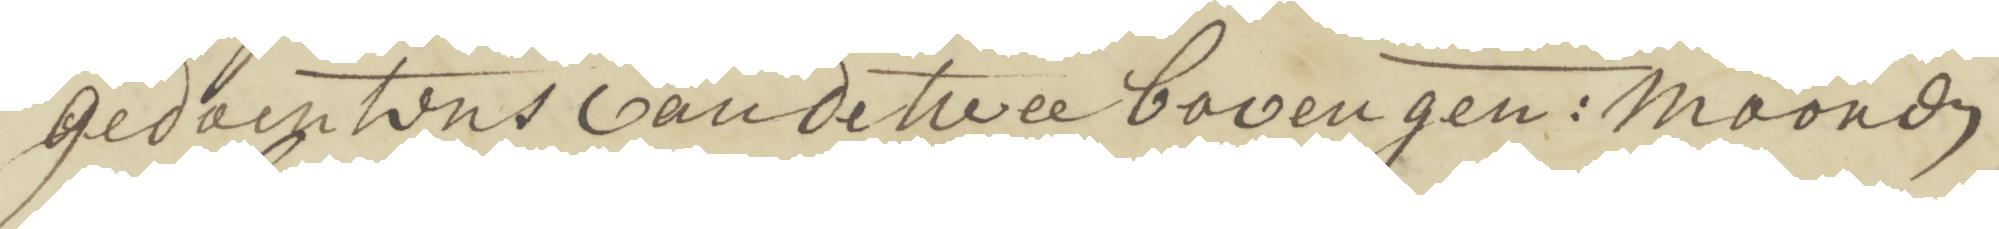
gedoentens van de twee boven gen: mooren
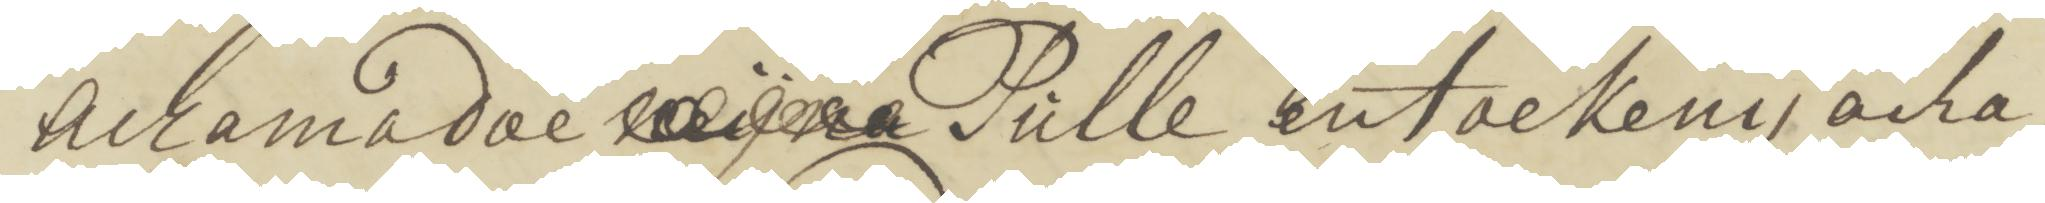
Achamadoe neijna Pulle en toekenij acha
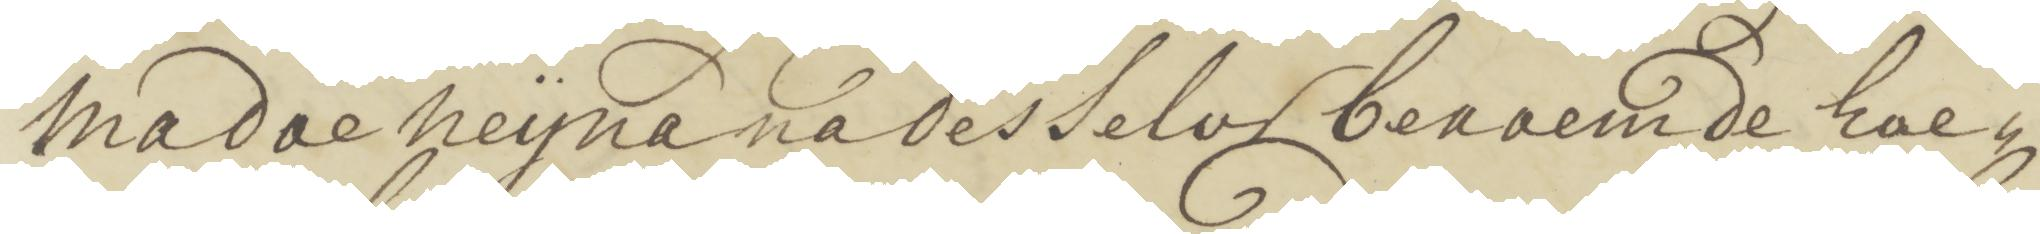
madoe neijna na desselvs beraemde hoe„
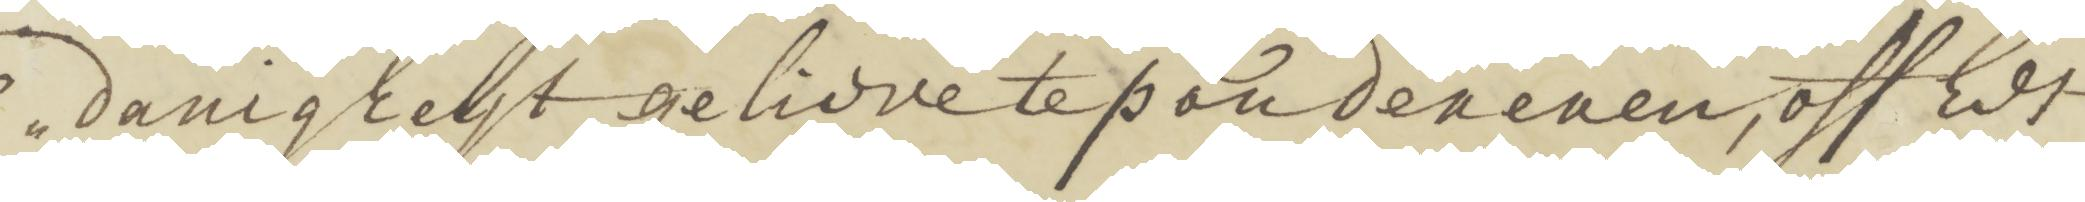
„danigheijt gelieve te pondereren, off het
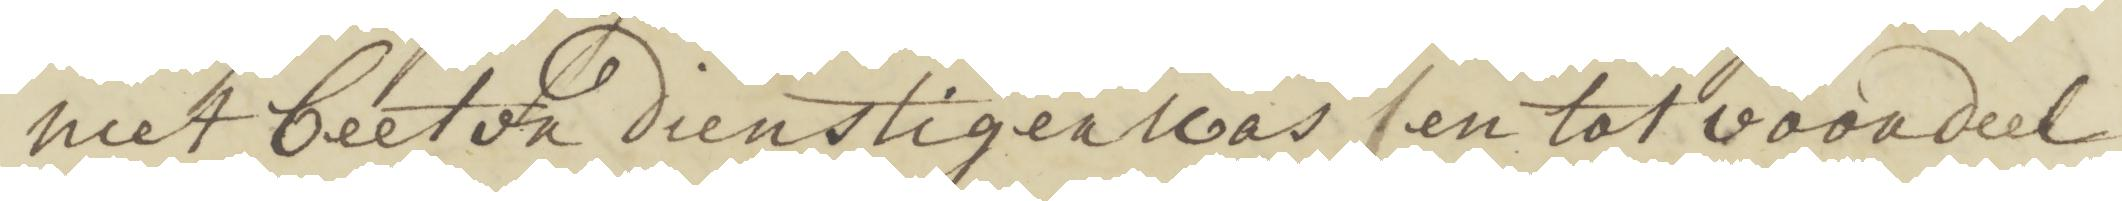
niet beeter dienstiger was en tot voordeel
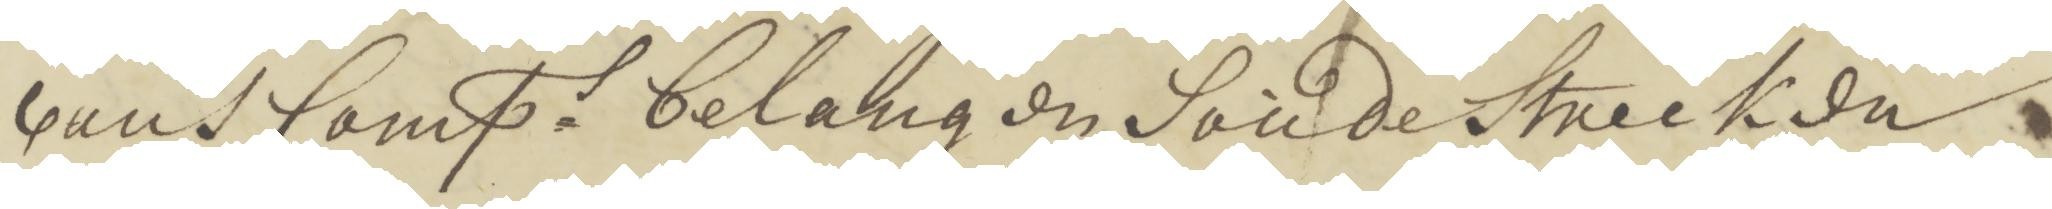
van ’s Comp=s belangen soude strecken
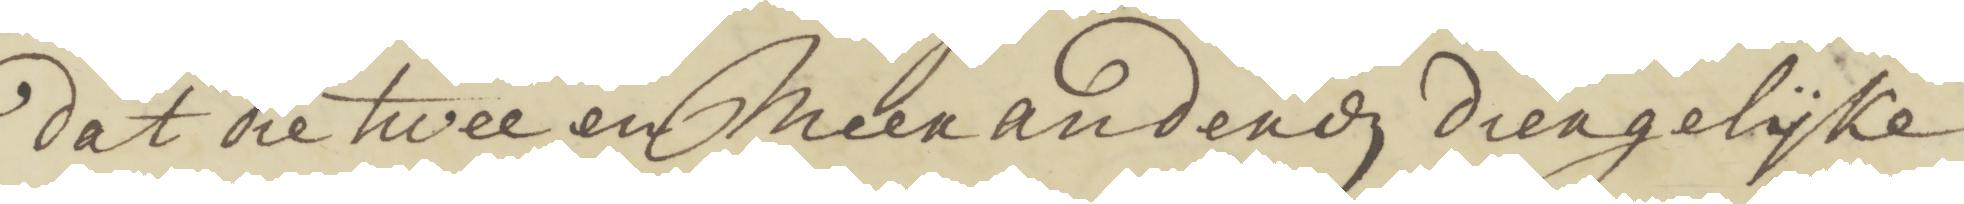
dat die twee en Meer anderen diergelijke
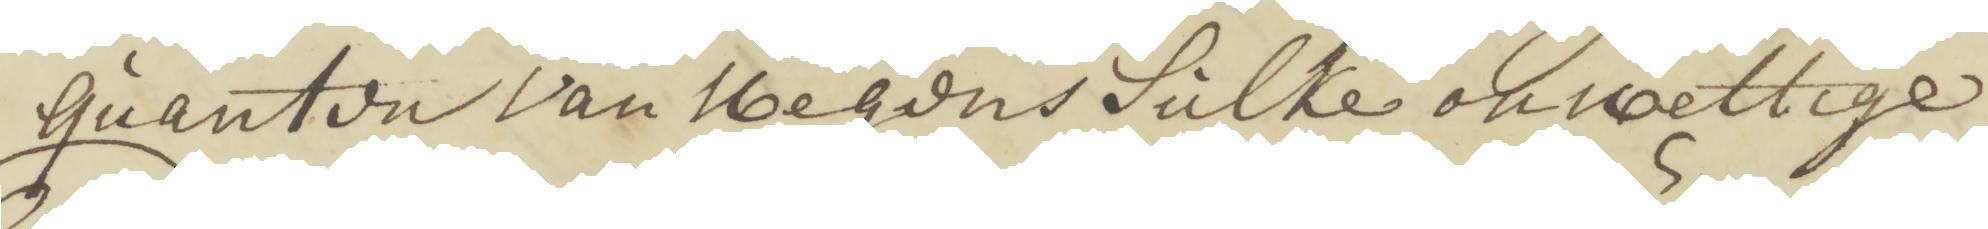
quanten van wegens sulke onwettige
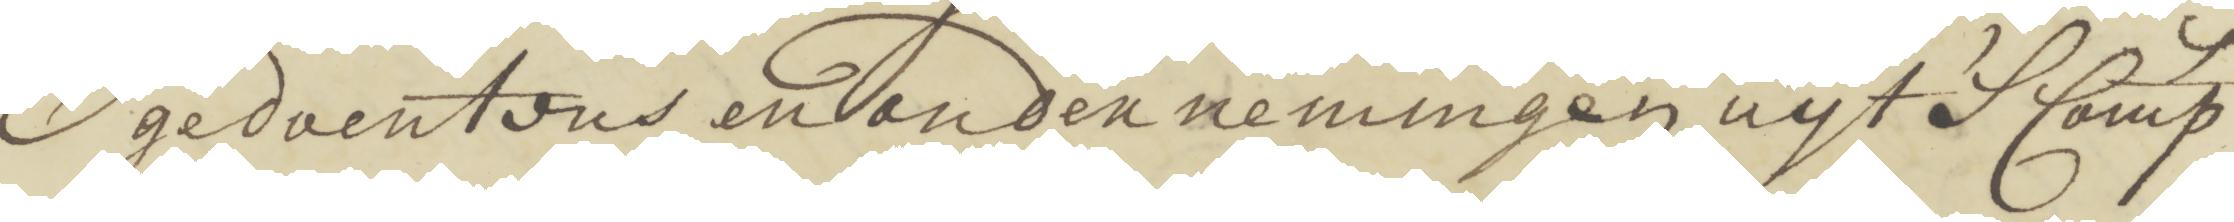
gedoentens en ondernemingen uijt ’s Comps
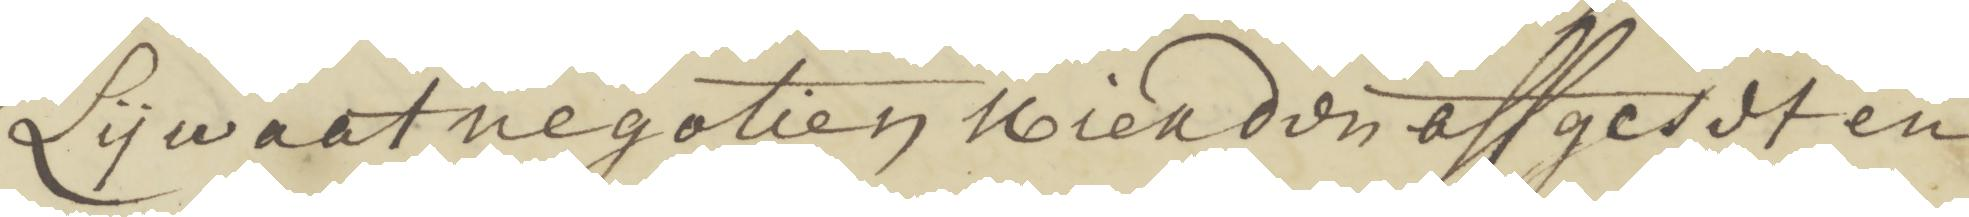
Lijwaat negotien wierden affgeset en
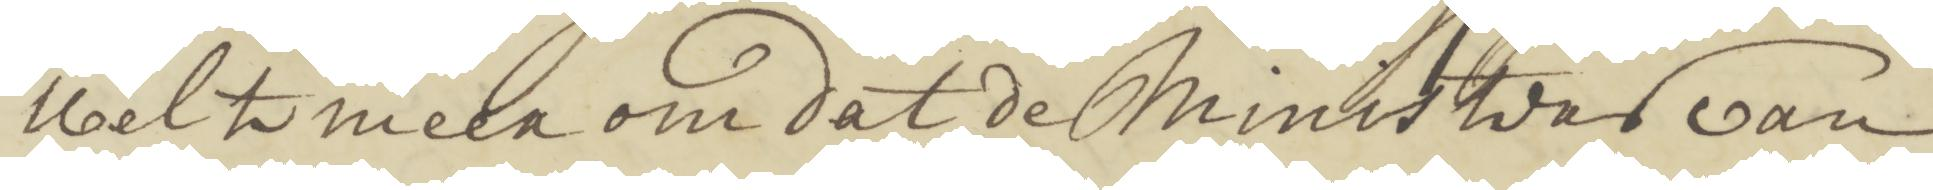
wel te meer om dat de Ministers van
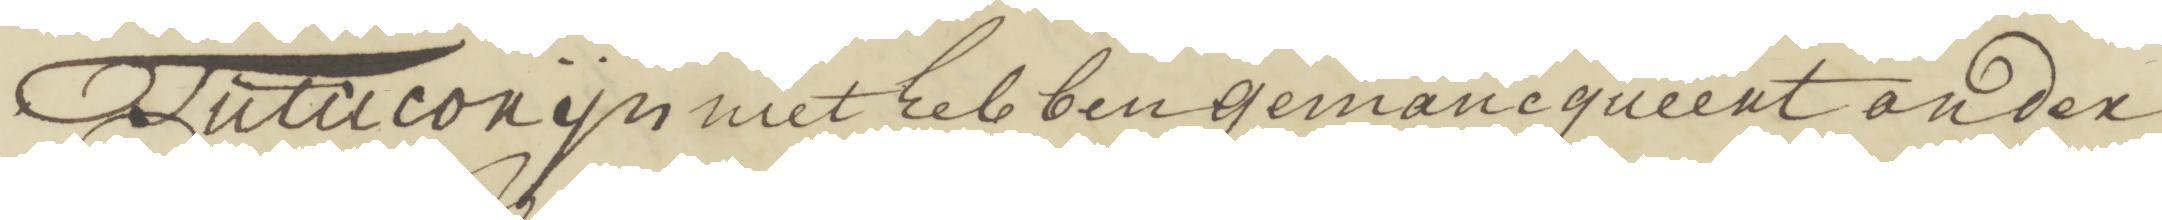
Tutucorijn niet hebben gemancqueert onder
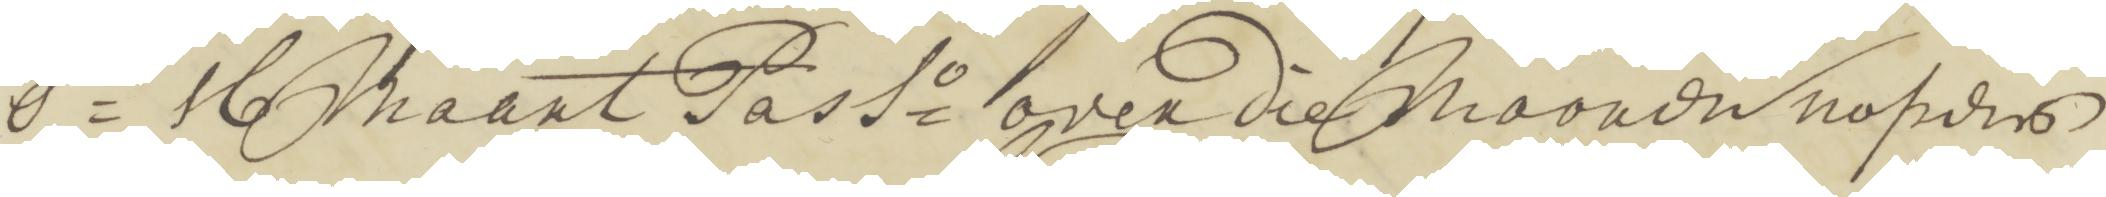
d=o 16 Maart Pass=o over die Mooren nopens
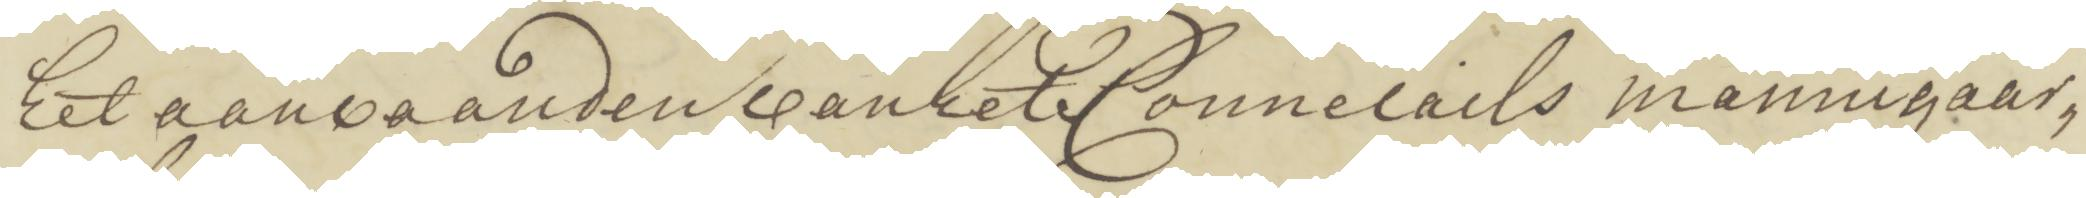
het aanvaarden van het Connecails mannigaar„
